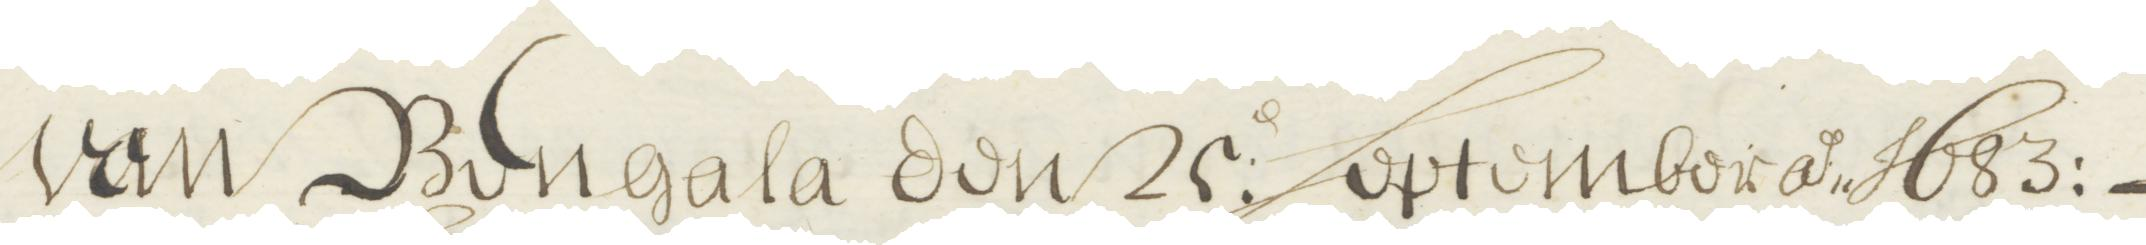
van Bengala den 25:e September a„o 1683: —
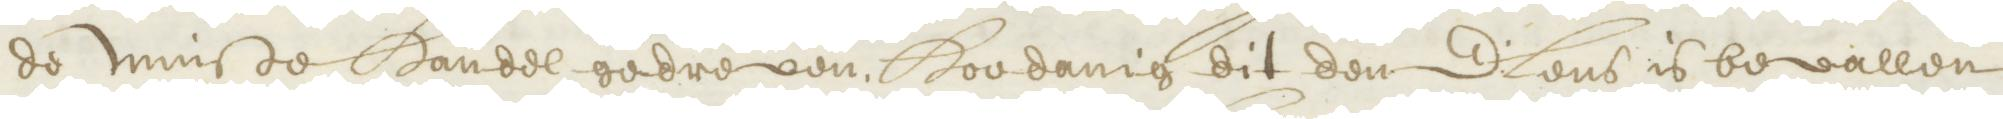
de minste Handel gedreven. Hoedanig dit den E:lens is bevallen
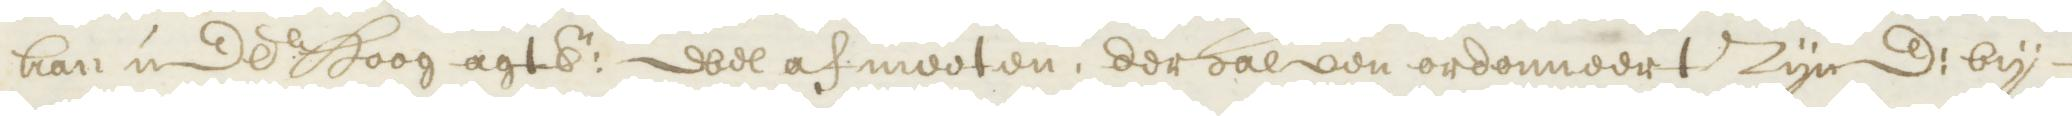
kan u Ed.e Hoog agtb:n wel afmeeten, derhalven ordonneert zijn E: bij
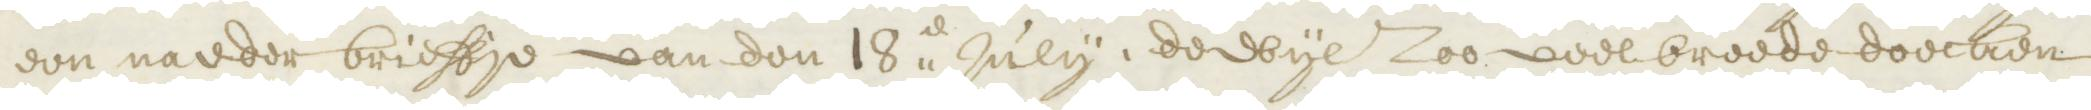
een naeder brieffje van den 18„e Julij, dewijl zoo veel breede doecken
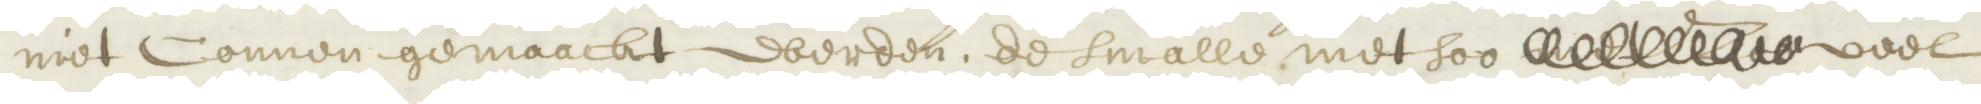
niet connen gemaackt werden, de smalle met soo met Zoo veel
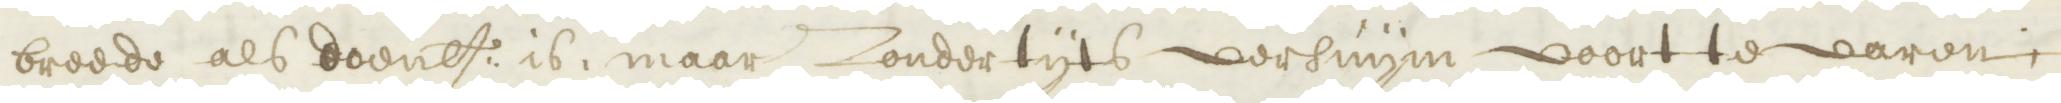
breede als doenlijk is, maar zonder tijts versuijm voort te varen;
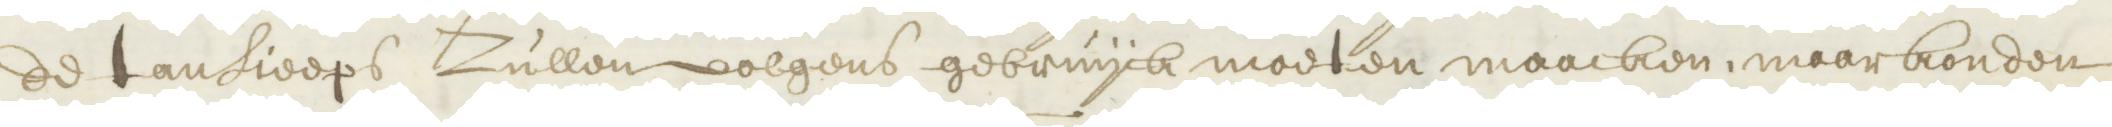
de tansieeps zullen volgens gebruijck moeten maacken, maar konden
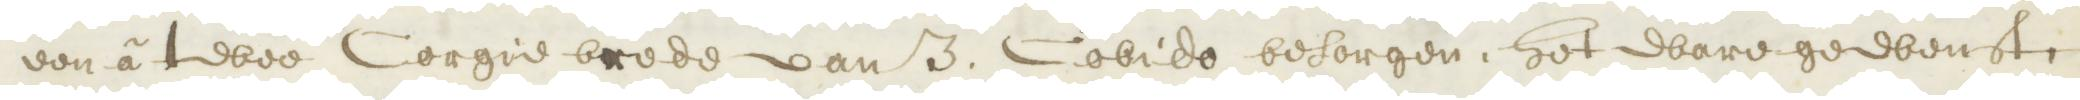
een â twee Cargie brede van 3. Cobido besorgen, het ware gewenst,
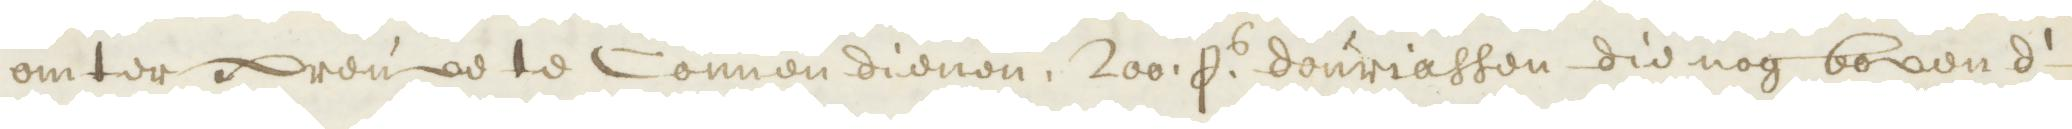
om ter preuve te connen dienen, 200. p.s douriassen die nog boven d'
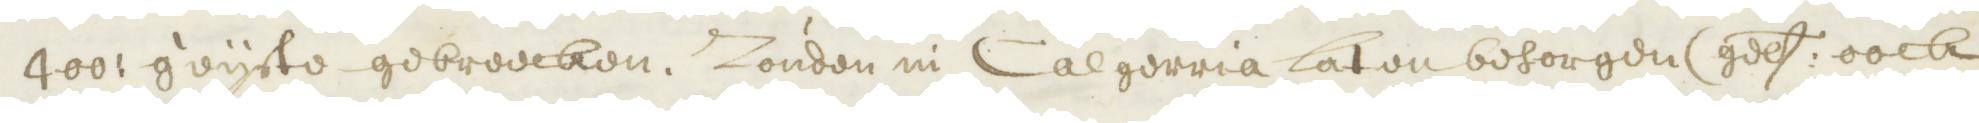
400: g’eijste gebreecken, zouden in Calgerria laten besorgen (gelijk oock
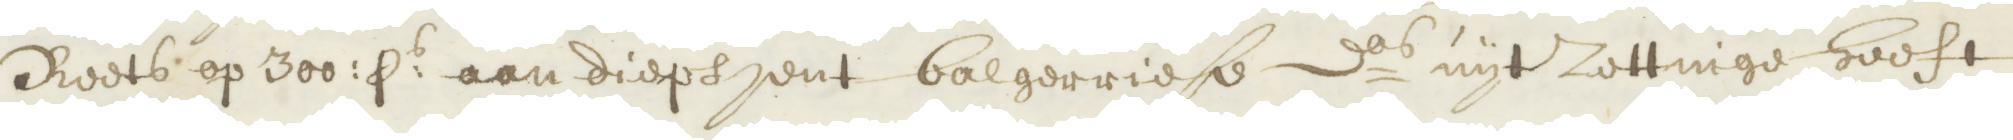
Reets op 300: p:s aan diepsjent balgerriese D=os uijtzettinge heeft
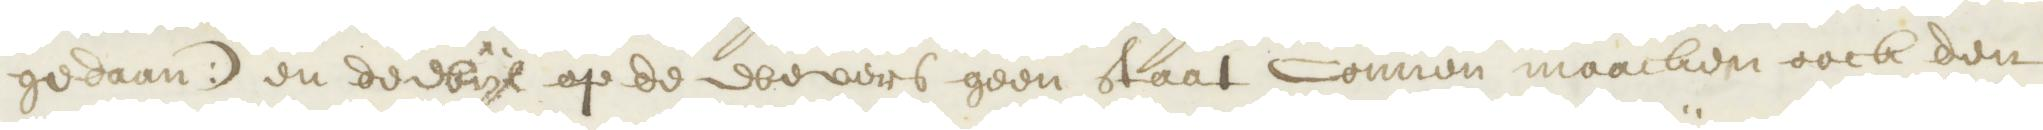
gedaan :) en dewijl op de wevers geen staat connen maacken oock den
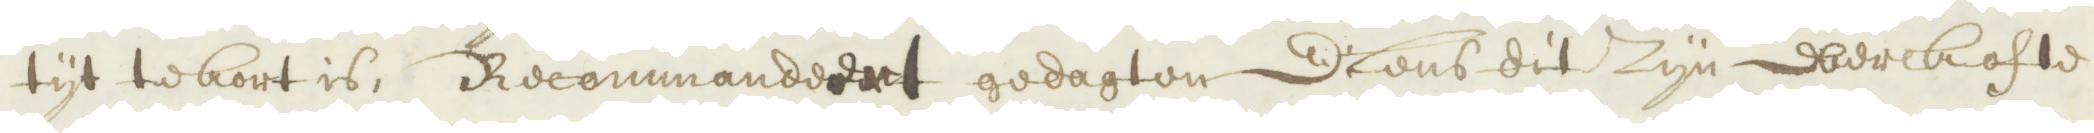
tijt te kort is, Recommandeert gedagten E'lens dit zijn werck ofte
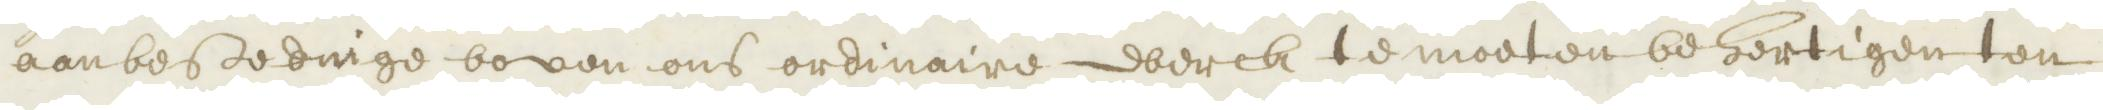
aanbestedinge boven ons ordinaire werck te moeten behertigen ten
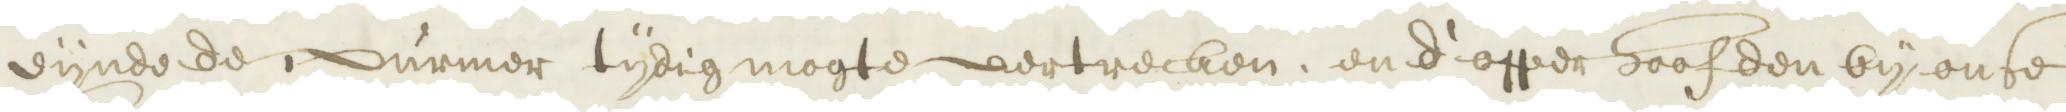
eijnde de purmer tijdig mogte vertrecken, en d’opperhoofden bij onse
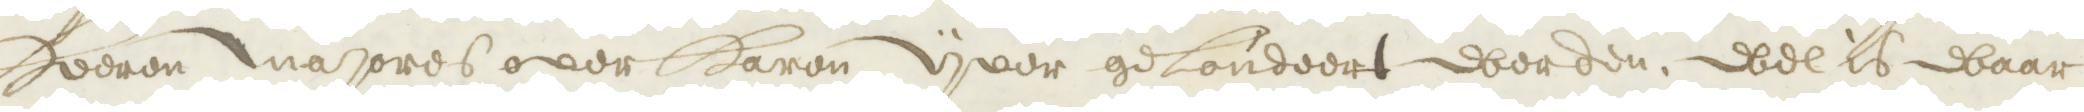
Heeren majores over Haren ijver geloudeert werden, wel is waar
